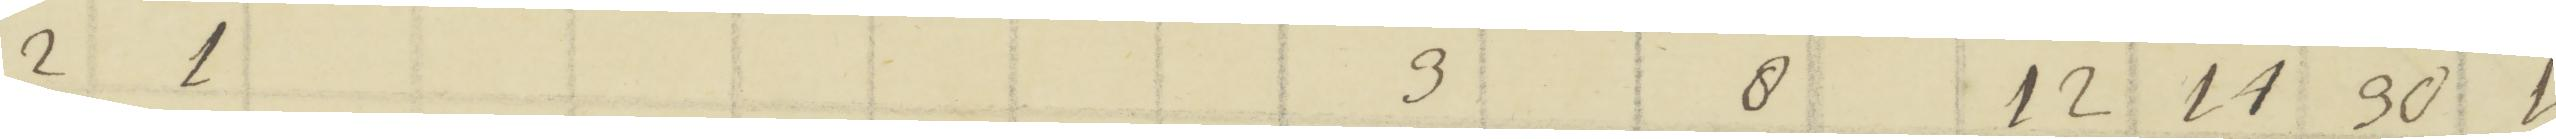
2 1 3 8 12 14 30 1
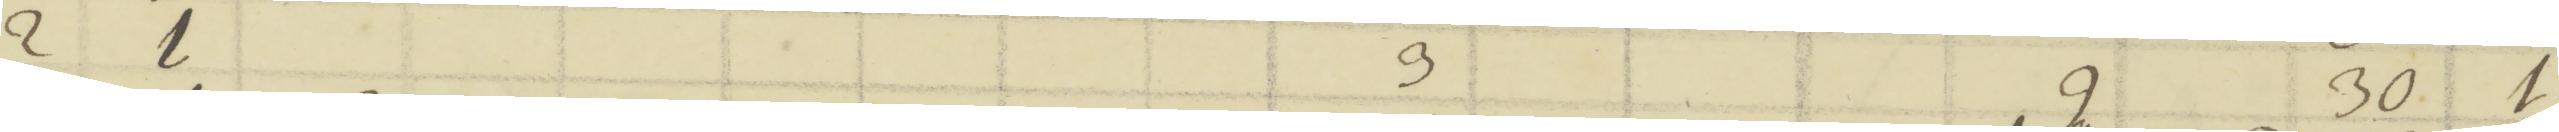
2 1 3 9 30 1
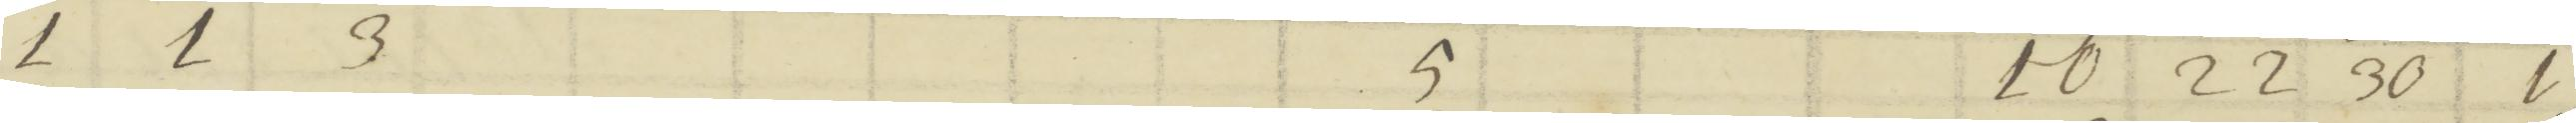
1 1 3 5 10 22 30 1
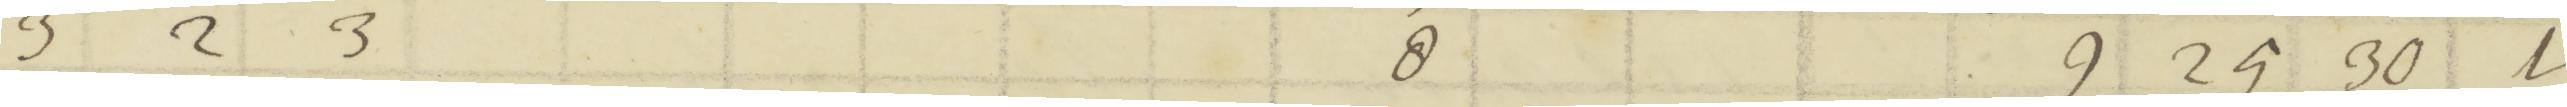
3 2 3 8 9 25 30 1
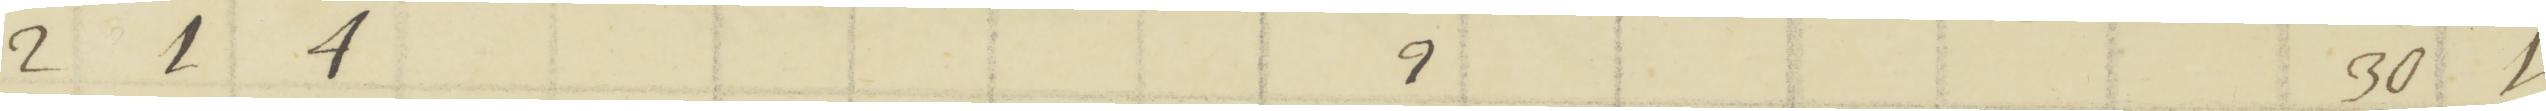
2 1 4 9 30 1
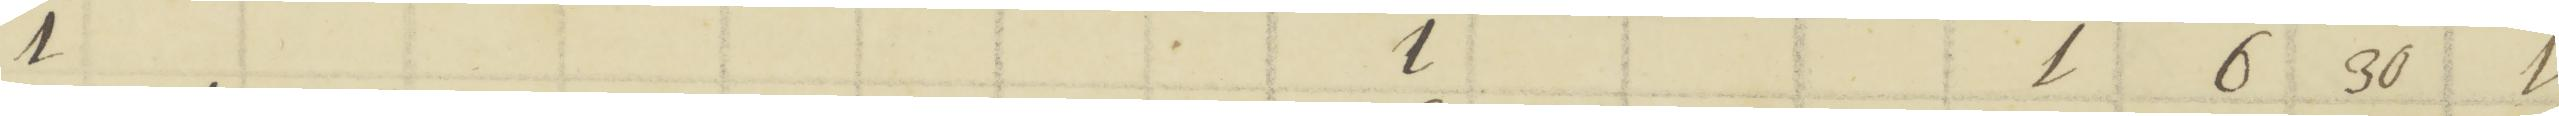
1 1 1 6 30 1
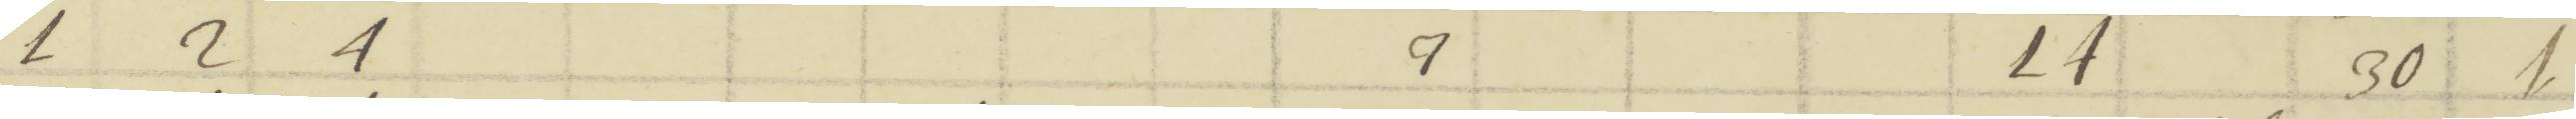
1 2 4 7 14 30 1
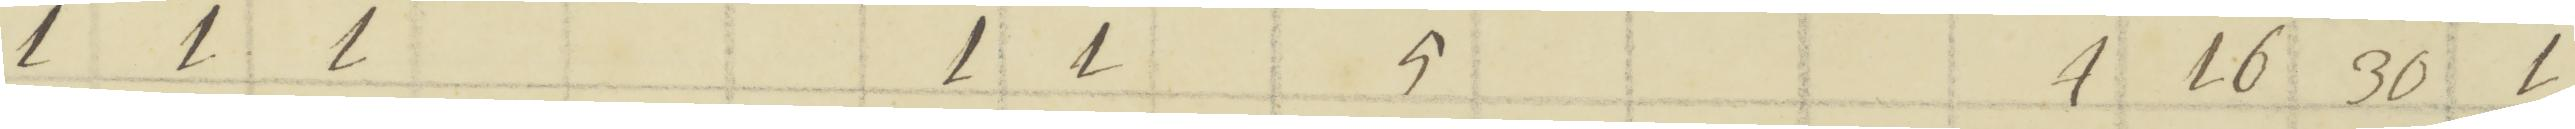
1 1 1 1 1 5 4 16 30 1
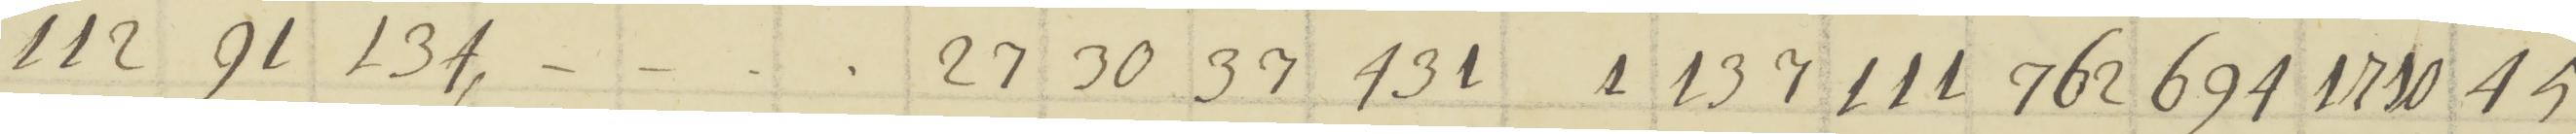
112 91 134, – – . . 27 30 37 431 1 137 111 762 694 1710 45
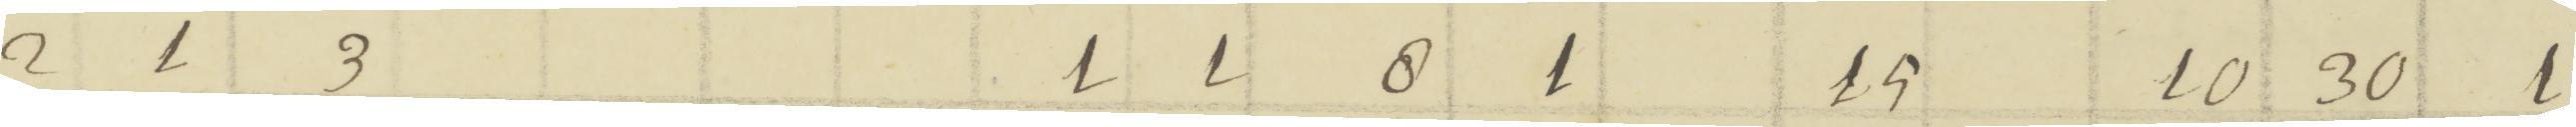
2 1 3 1 1 8 1 15 10 30 1
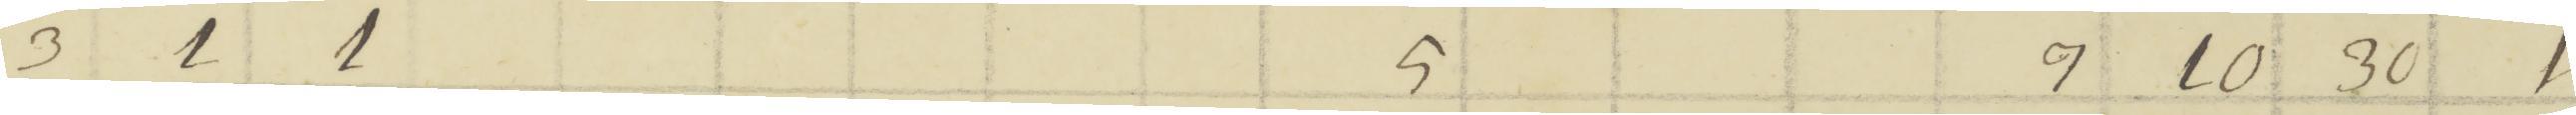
3 1 1 5 9 10 30 1
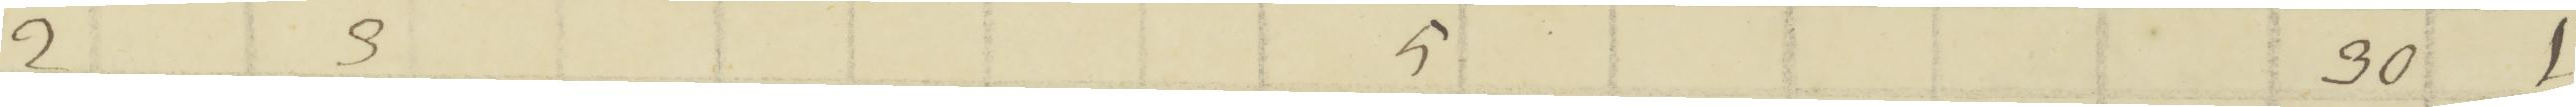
2 3 5 30 1
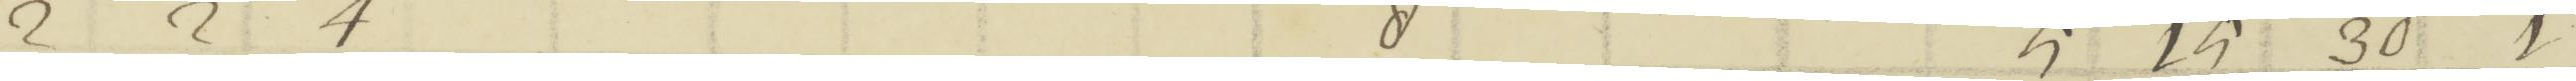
2 2 4 8 5 15 30 1
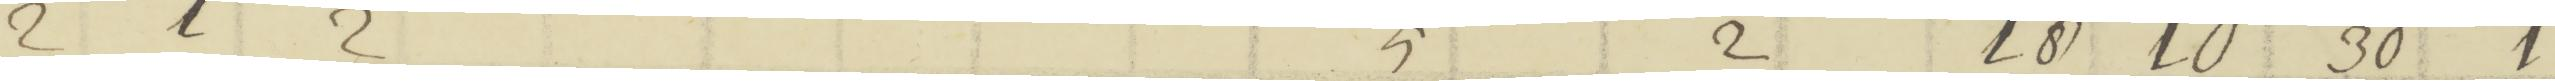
2 1 2 5 2 18 10 30 1
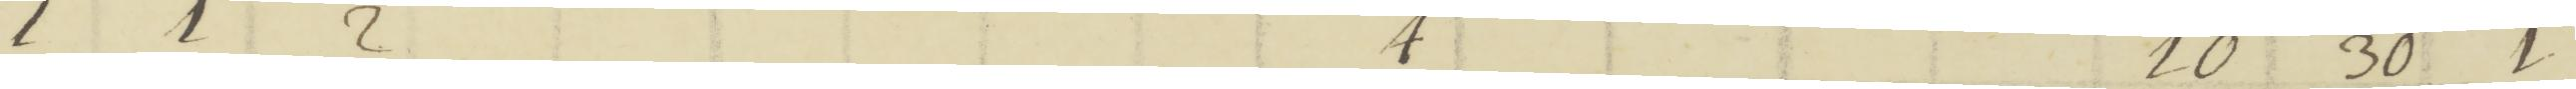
1 1 2 4 10 30 1
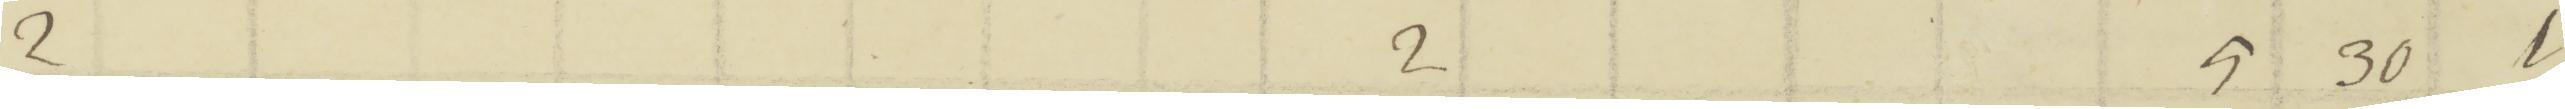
2 2 5 30 1
